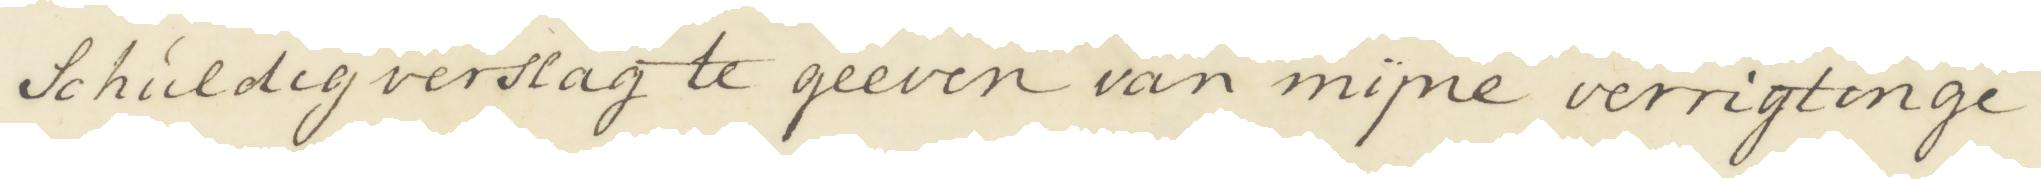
schuldig verslag te geeven van mijne verrigtinge
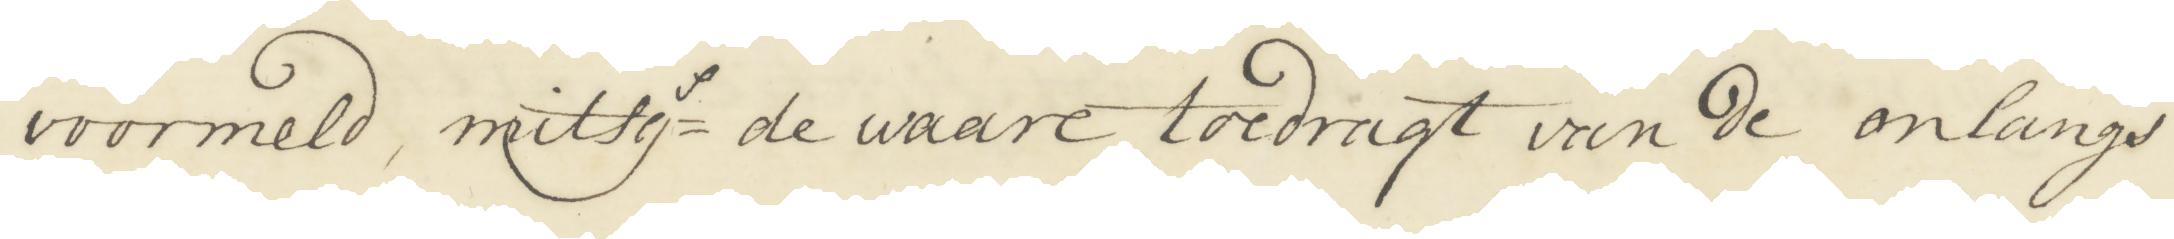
voormeld, mitsg=s de waare toedragt van de onlangs
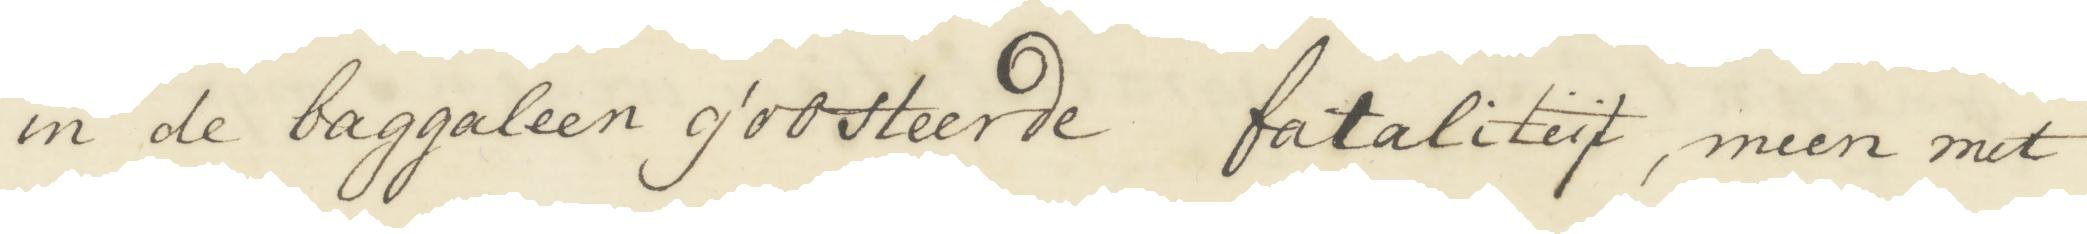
in de baggaleen g'obsteerde fataliteijt, meen met
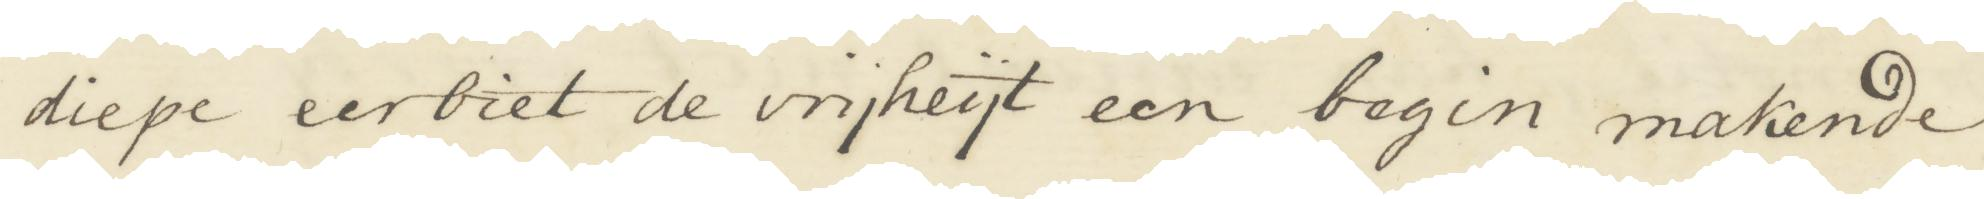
diepe eerbiet de vrijheijt een begin makende
